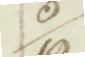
5/19
